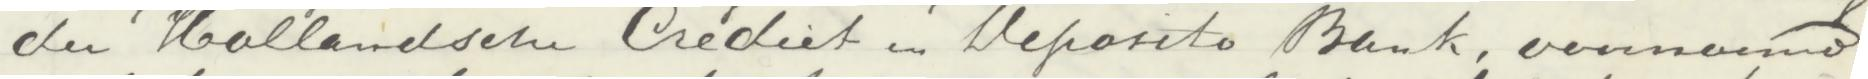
der Hollandsche Crediet en Deposito Bank, voornoemd
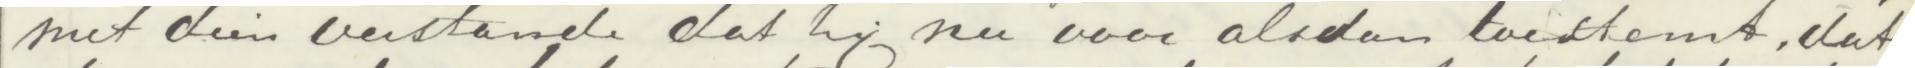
met dien verstande dat hij nu voor alsdan toestemt, dat
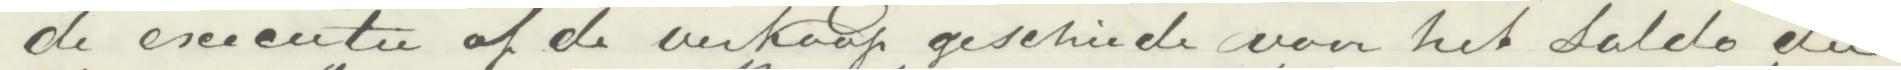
de executie of de verkoop geschiede voor het saldo der
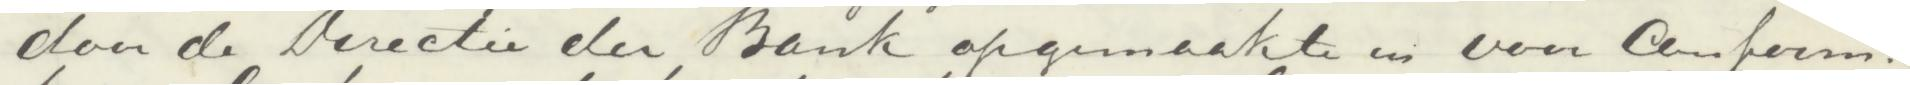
door de Directie der Bank opgemaakte en voor Conform.
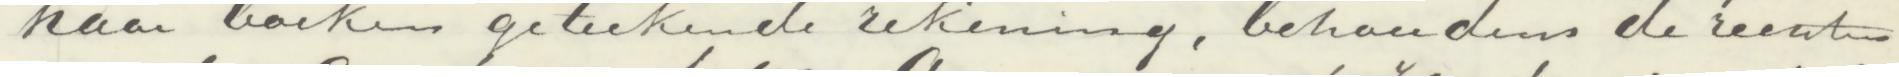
haar boeken geteekende rekening, behoudens de rechten
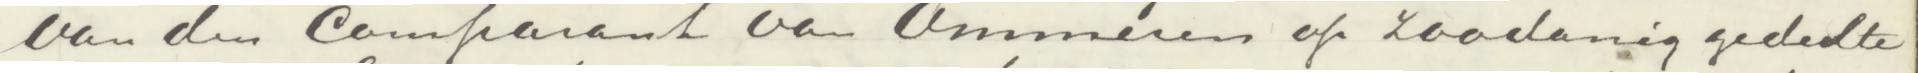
van den Comparant van Ommeren op zoodanig gedeelte
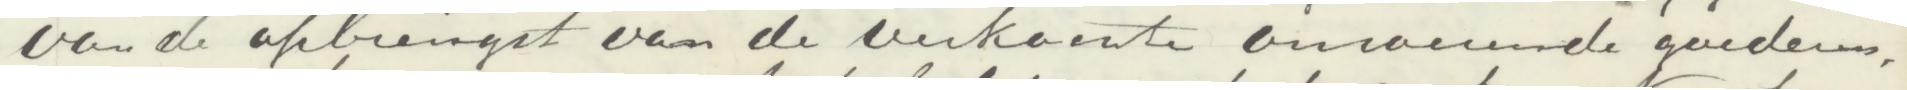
van de opbrengst van de verkochte onnoerende goederen,
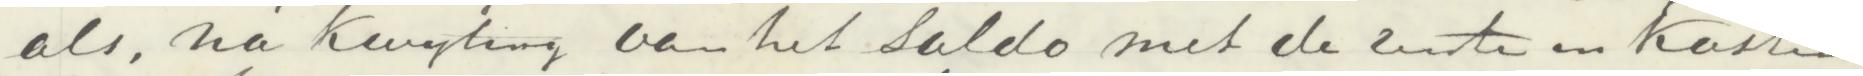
als, na kwyting van het saldo met de rente en kosten
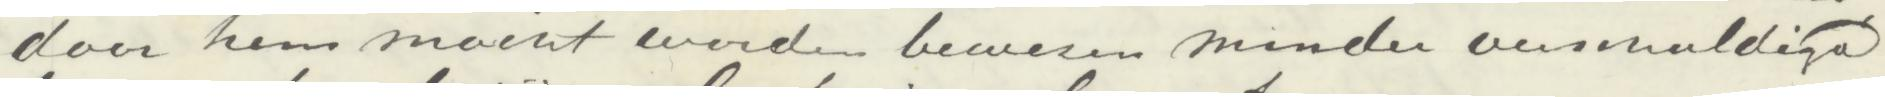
door hem mocht worden bewezen minder verschuldigd
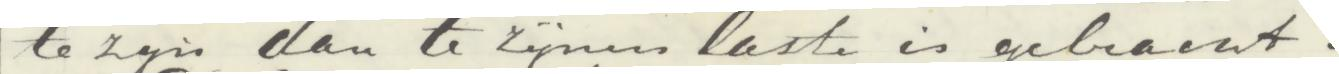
te zjn dan te zijnen laste is gebracnt.
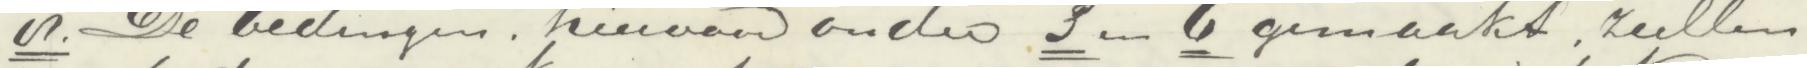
8. De bedingen, hiervoor onder 3 en 6 gemaakt, zullen
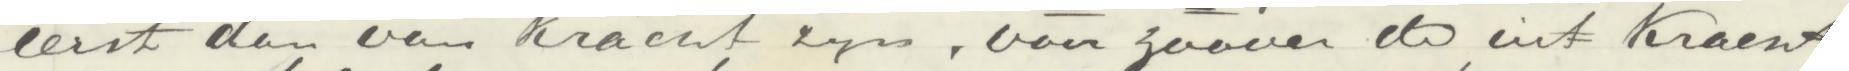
eerst dan van kracht zyn, voor zoover de uit kracht
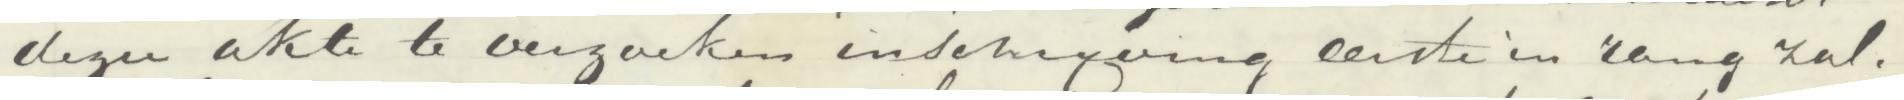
dezen akte te verzoeken inschryving eerste in rang zal.
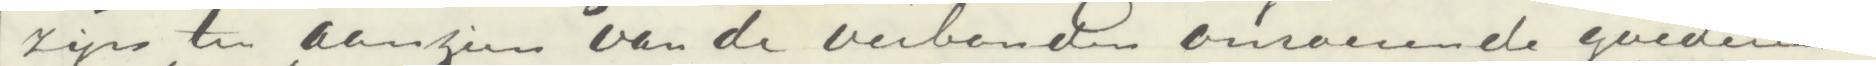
zijn ten aanzien van de verbonden onroerende goederen.
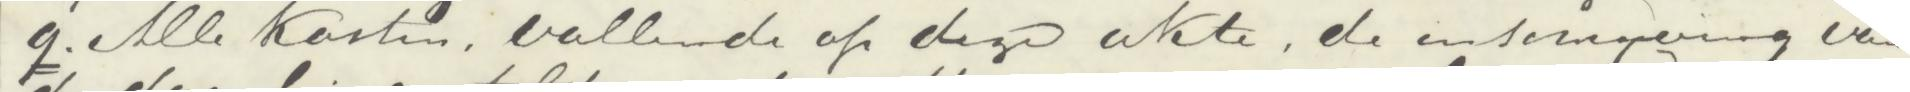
9. Alle kosten, vallende op deze akte, de inschryving van
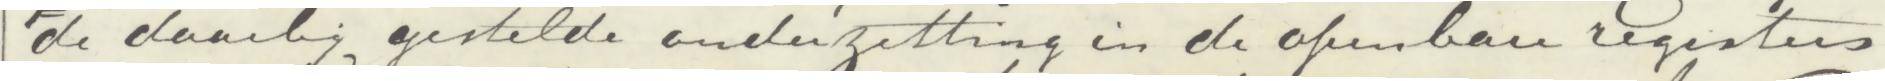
de daarbij gestelde onderzitting in de openbare registers
